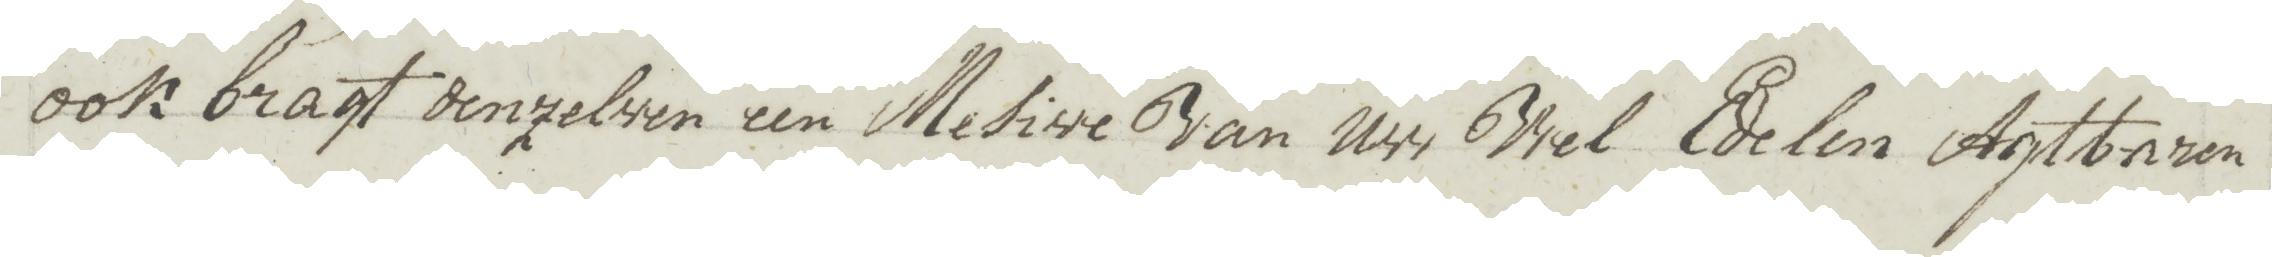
ook bragt denzelven een Mesive van uw Wel Edelen Agtbaren
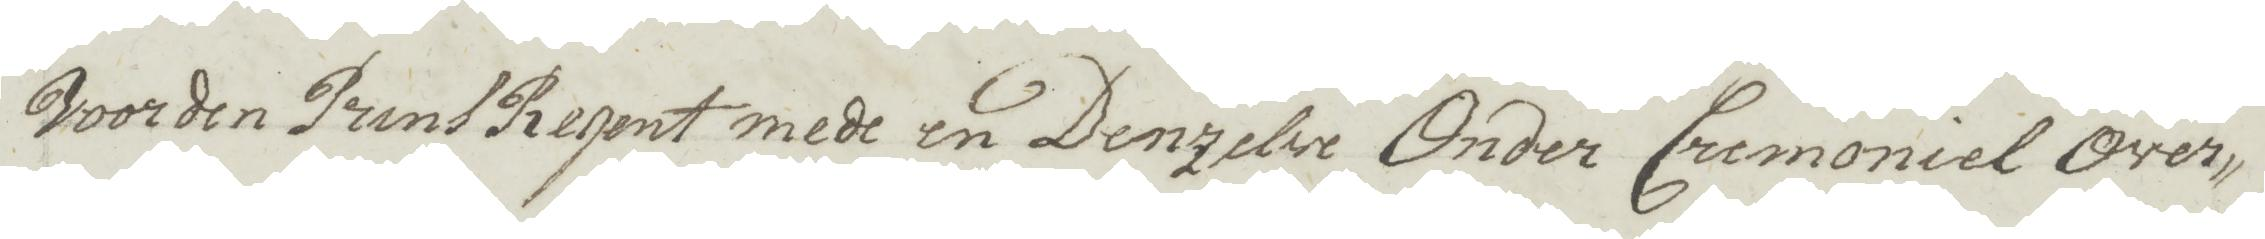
voor den Prins Regent mede en Denzelve Onder Cremoniel Over„
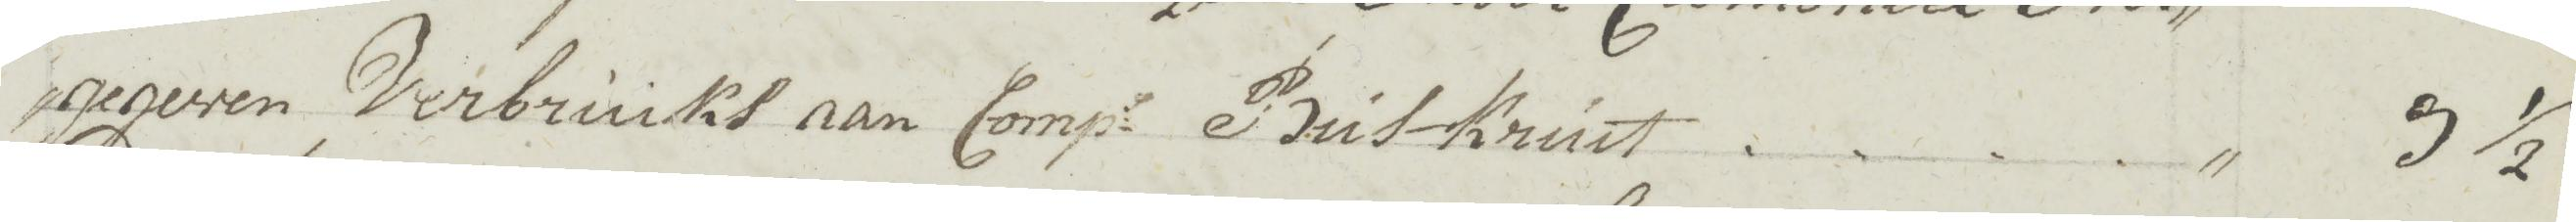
„gegeven Verbruiks aan Comp:s Buskruit - - - - „ 3 ½
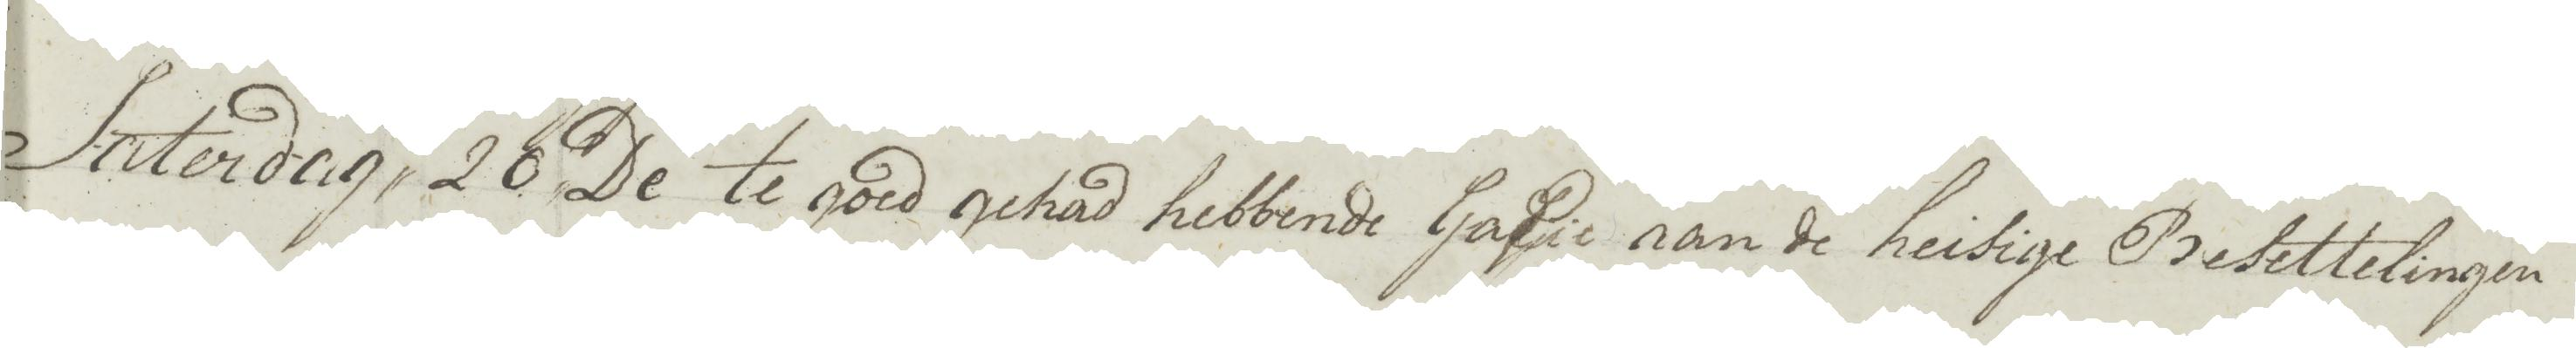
Saterdag „ 20„' De te goed gehad hebbende Gagie aan de heisige Besettelingen
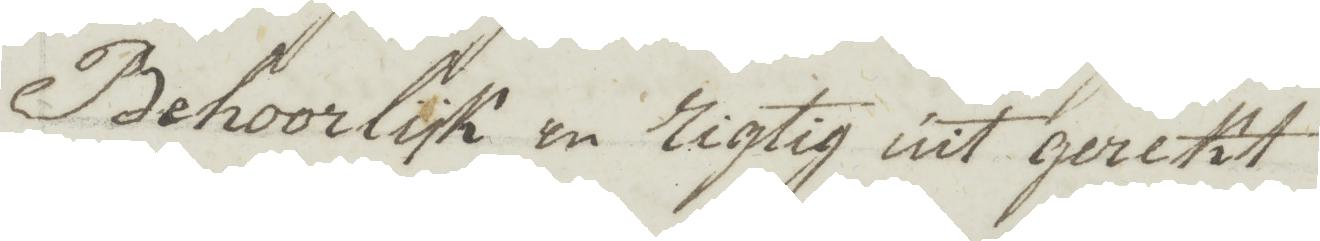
Behoorlijk en rigtig uit gerekt
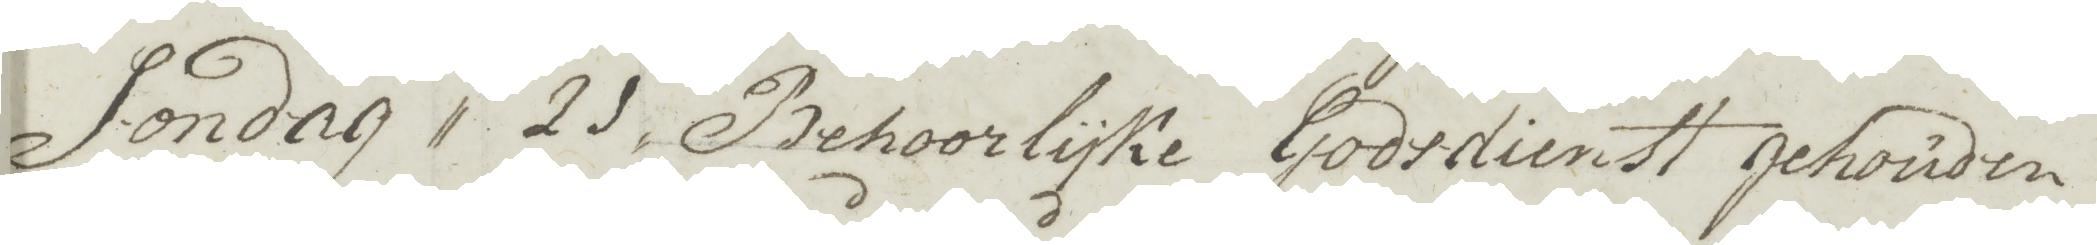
Sondag „ 21„d Behoorlijke Godsdienst gehouden
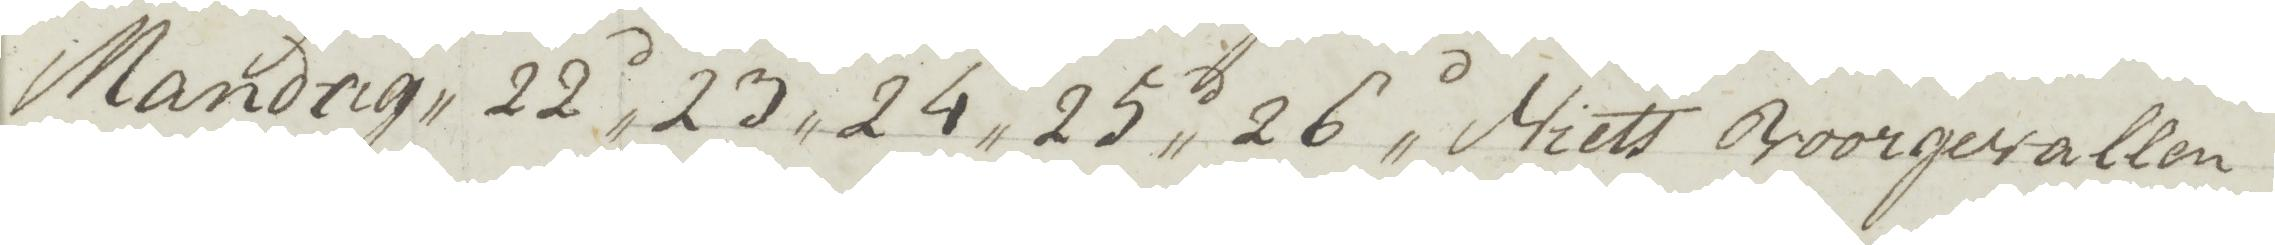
Mandag „ 22„d 23„d 24„d 25„d 26„d Niets voorgevallen
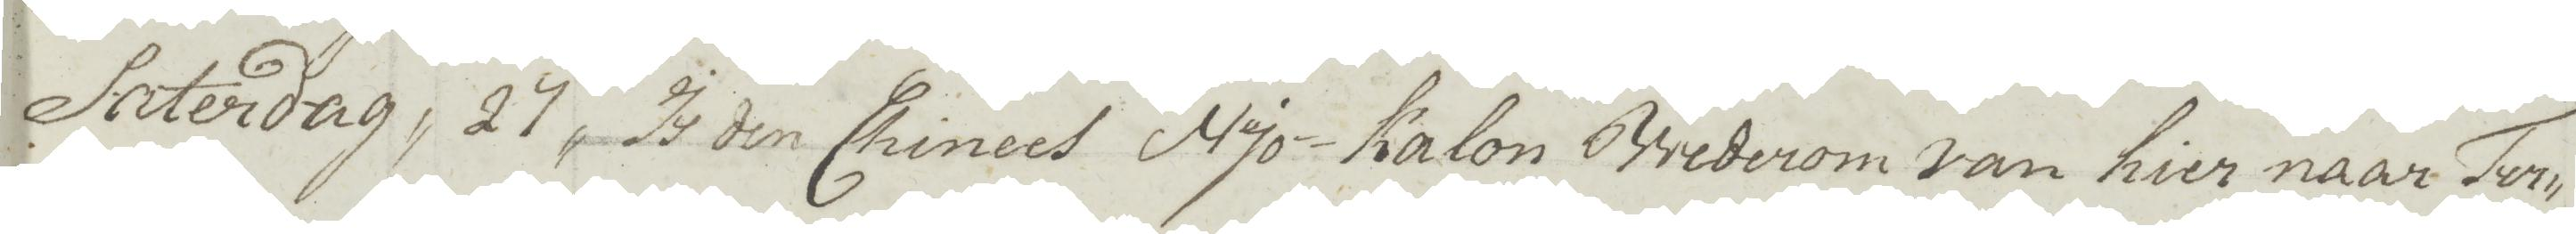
Saterdag „ 27„d Is den Chinees Mjo=kalon wederom van hier naar Ter„
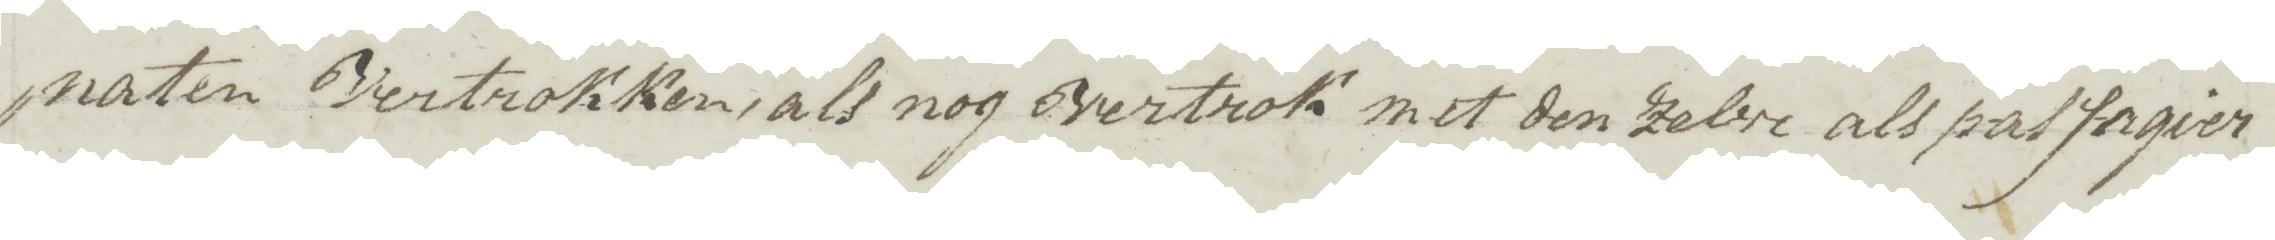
„naten vertrokken, als nog vertrok met den zelve als passagier
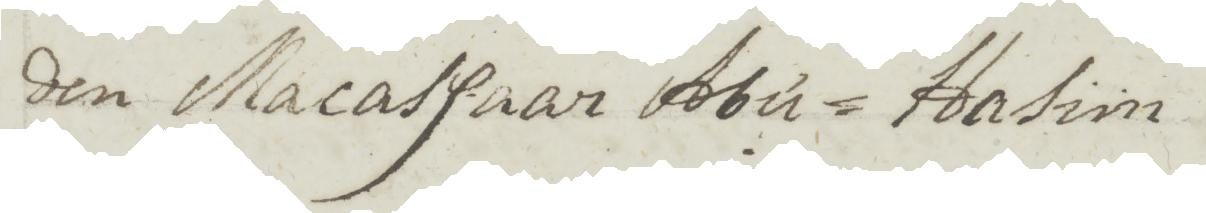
den Macassaar Abu=Hasim
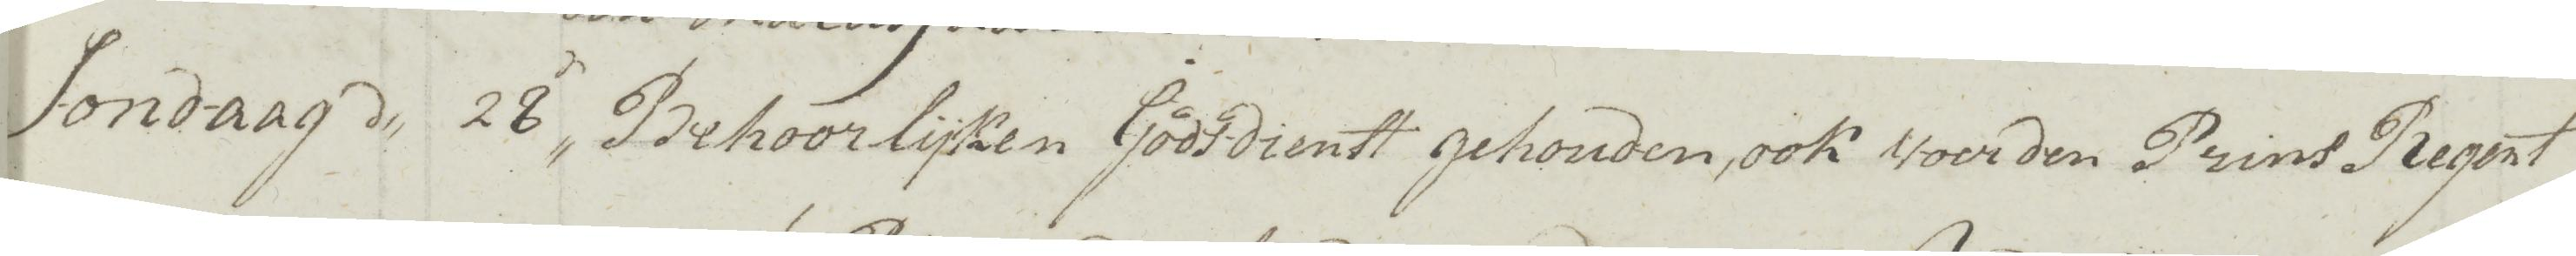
Sondaag d„ 28„d Behoorlijken Godsdienst gehouden, ook voer den Prins Regent
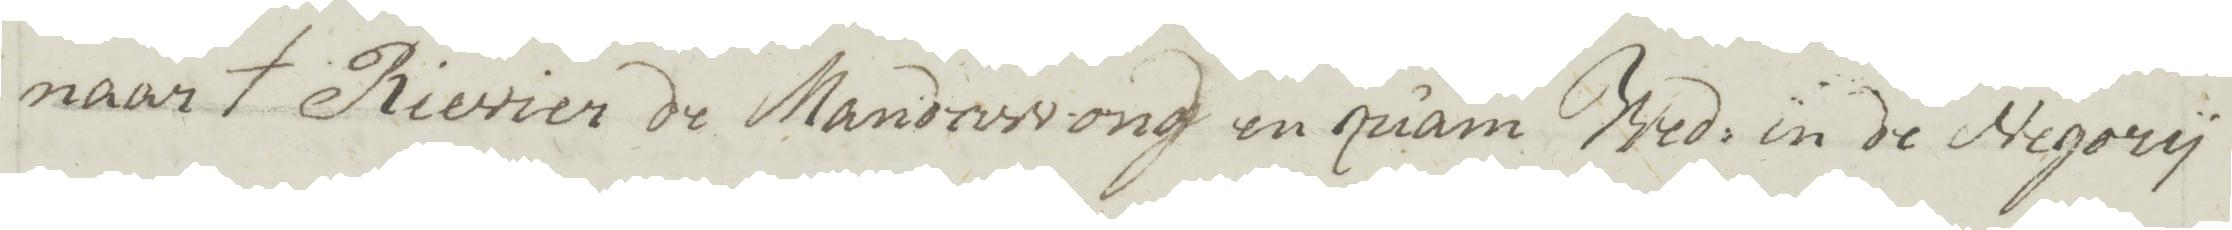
naar t Rievier de Mandawong en quam Wed: in de Negorij
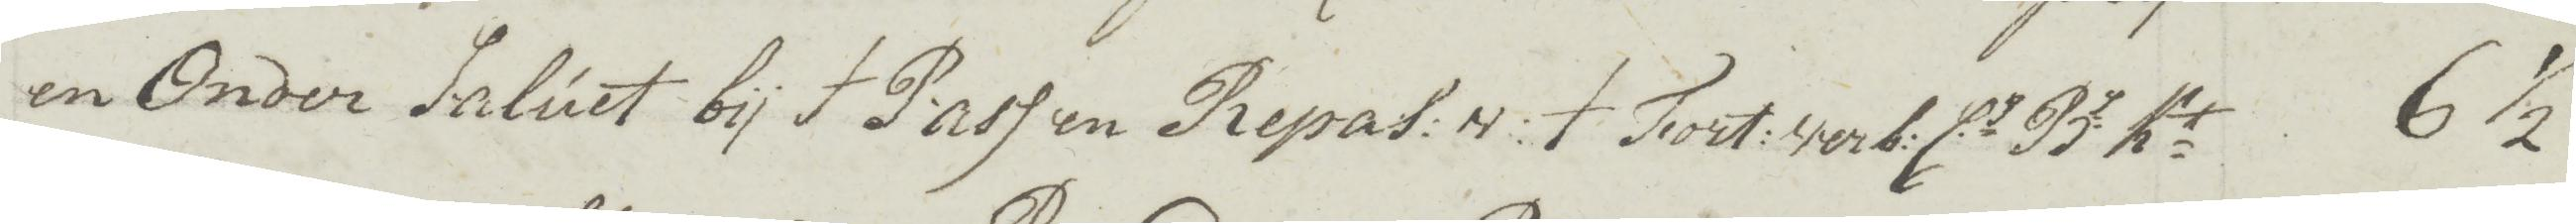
en Onder saluit bij t Pass en Repas: v: t Fort: verb: C=s B=s k=t 6 ½
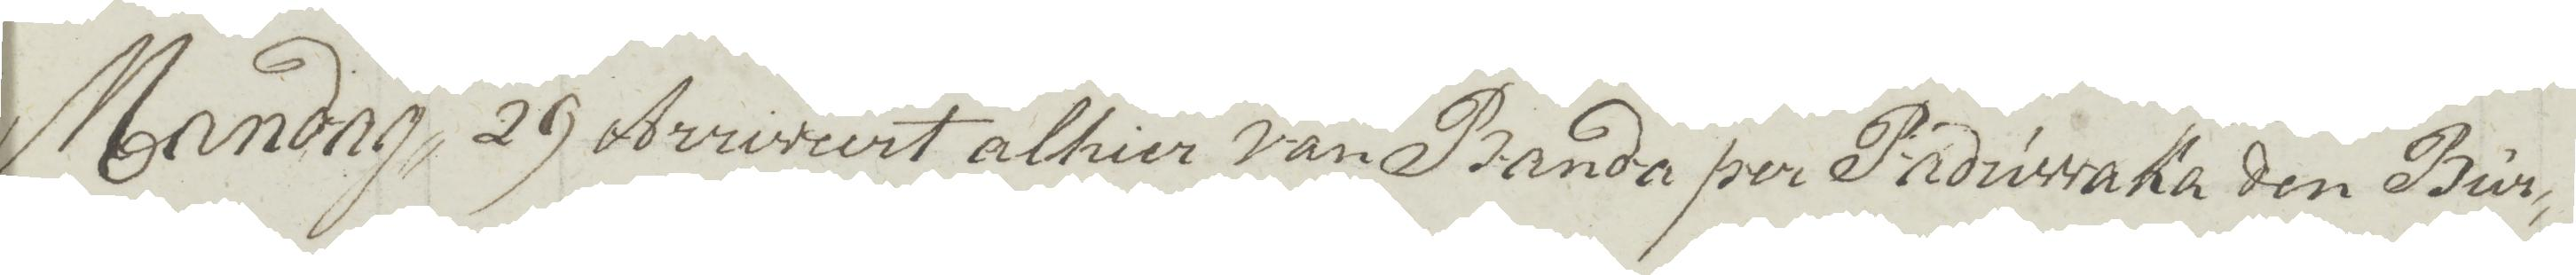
Mandag„ 29 Arriveert alhier van Banda per Paduwaka den Bur„
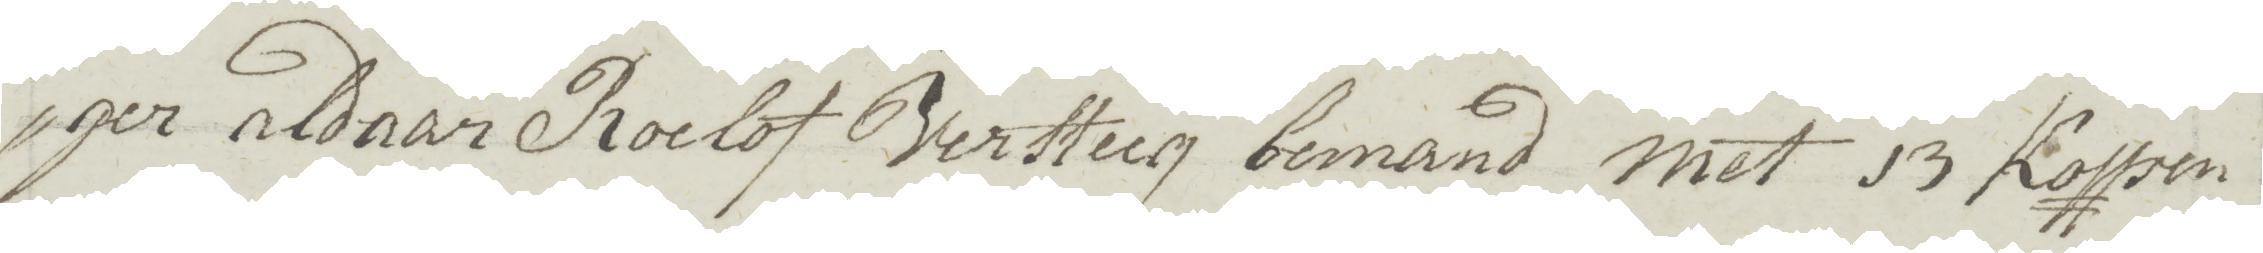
„ger aldaar Roelof Versteeg bemand met 13 Koppen
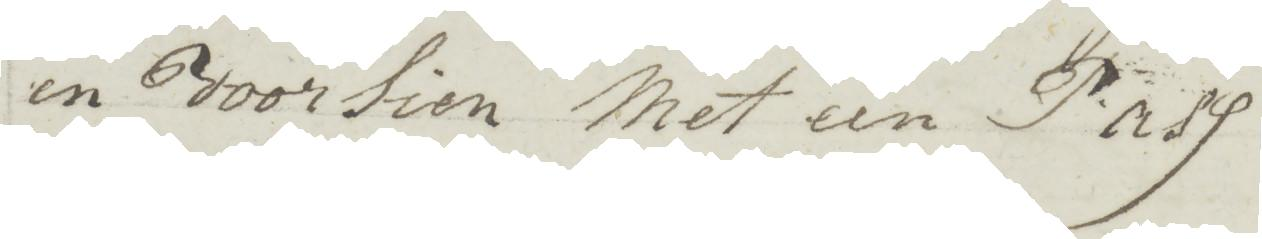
en voor sien met een Pass
